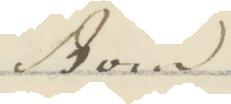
Bom
